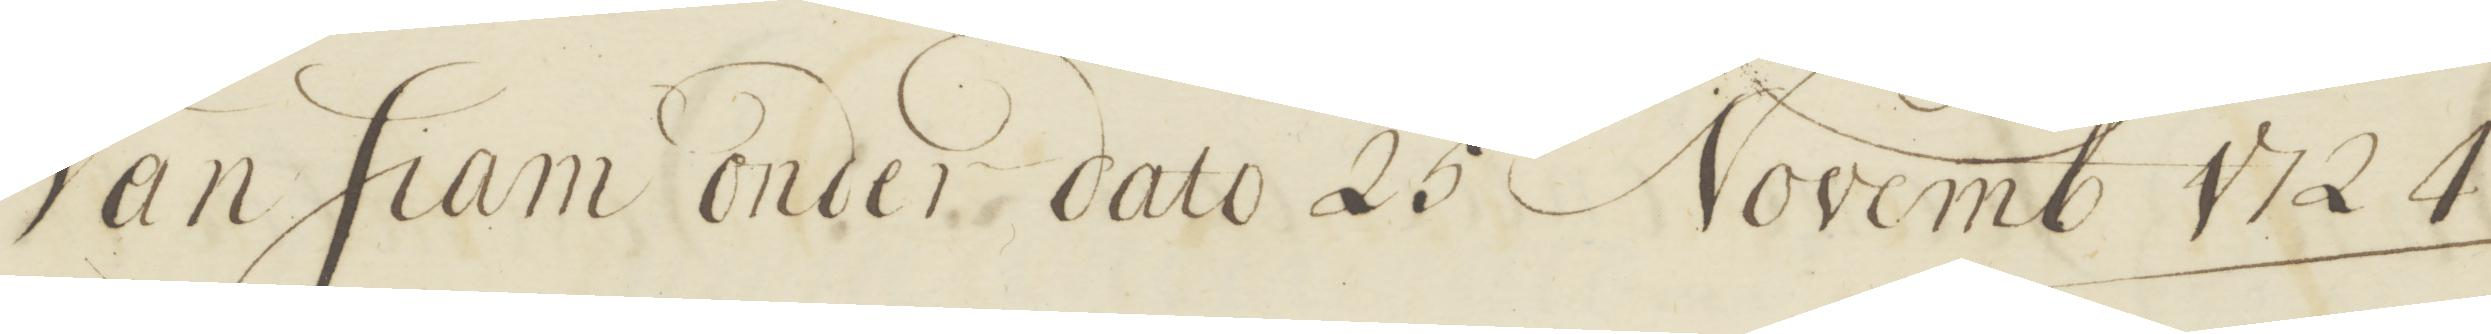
Van Siam onder dato 25 Novemb 1724
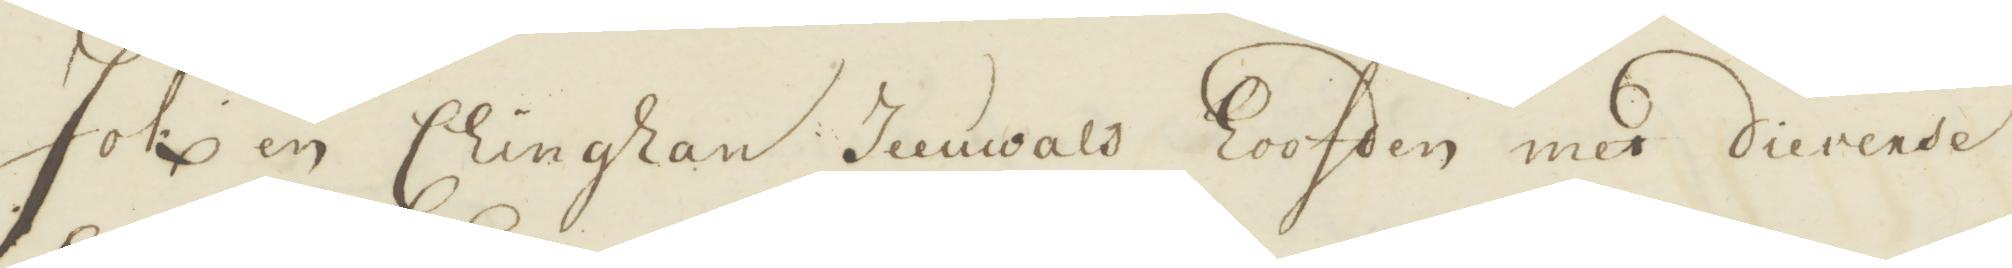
Jok en Chinghan Jeeuw als hoofden met dieverse
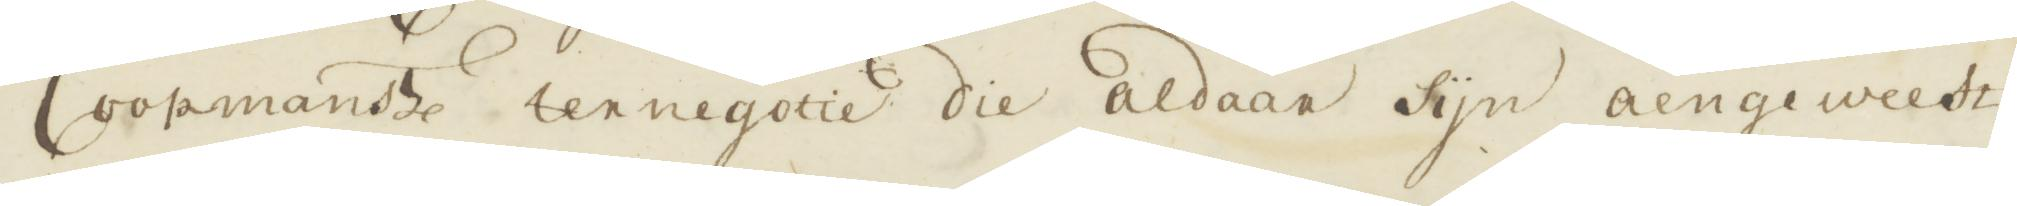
Coopmansz ter negotie die aldaar sijn aengeweest
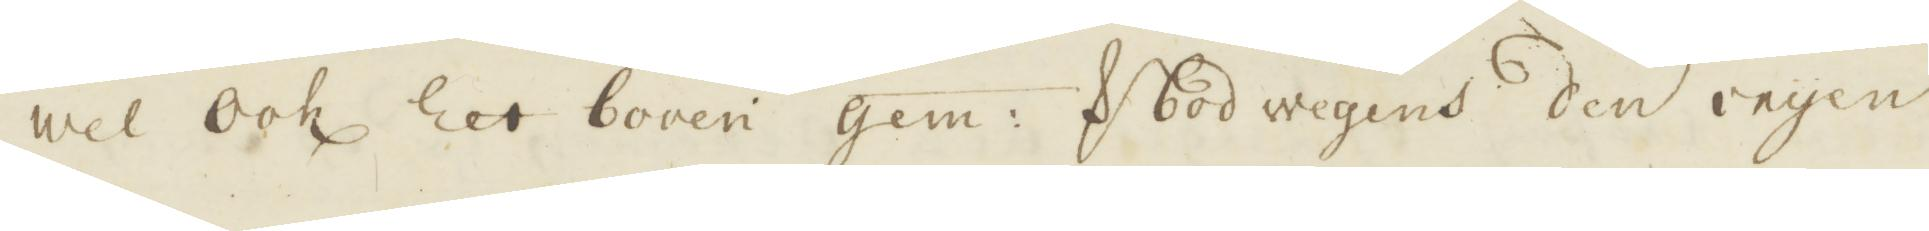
wel ook het boven gem: verbod wegens den vrijen
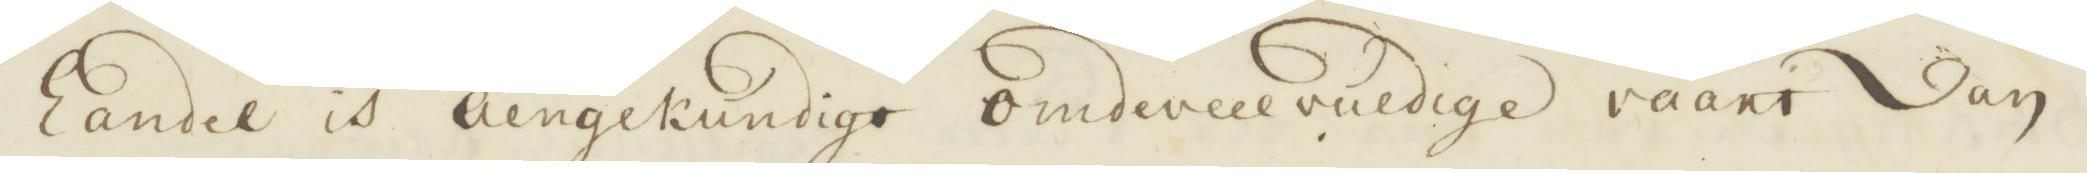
handel is aengekundigt om de veelvuldige vaart van
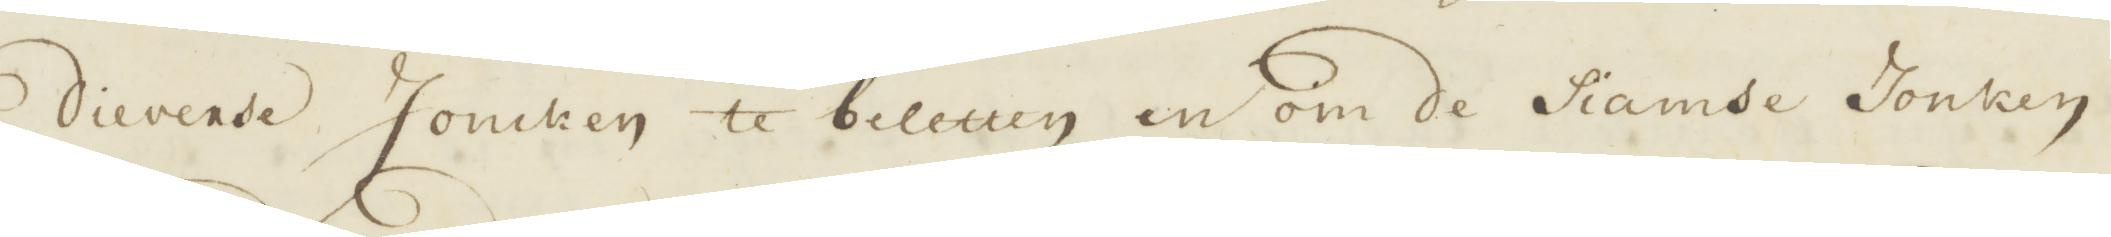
dieverse Jomken te beletten en om de siamse Jonken
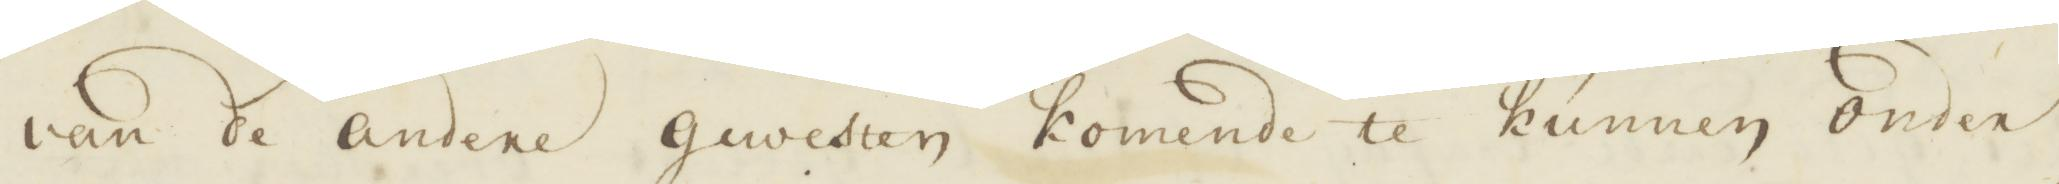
van de andere gewesten komende te kunnen onder
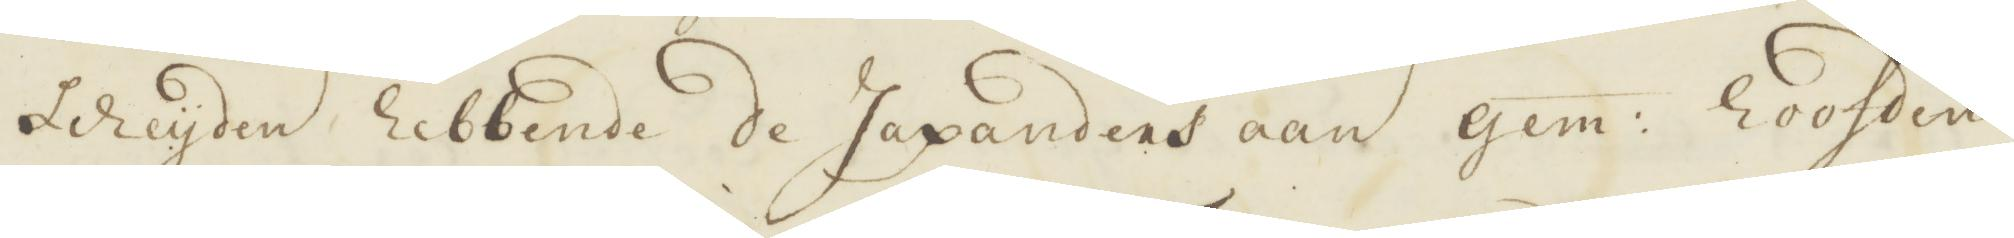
scheijden hebbende de Japanders aan gem: hoofden
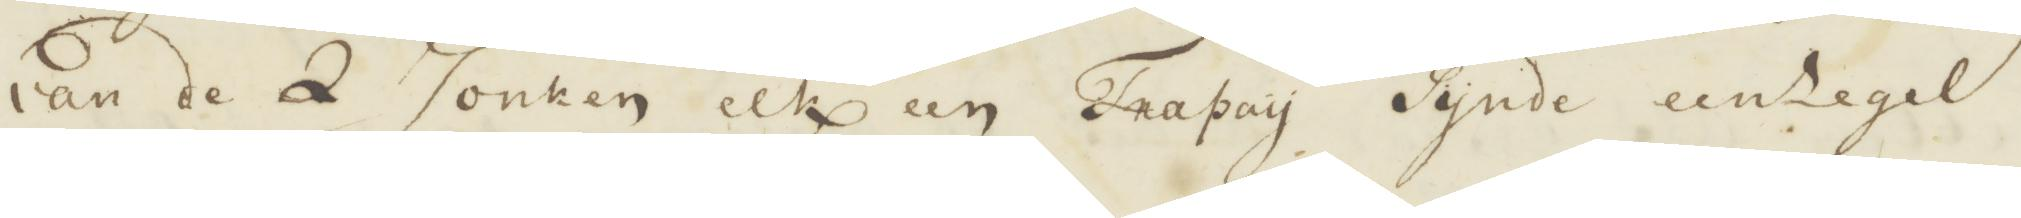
van de 2 Jonken elk een Trapaij sijnde een zegel
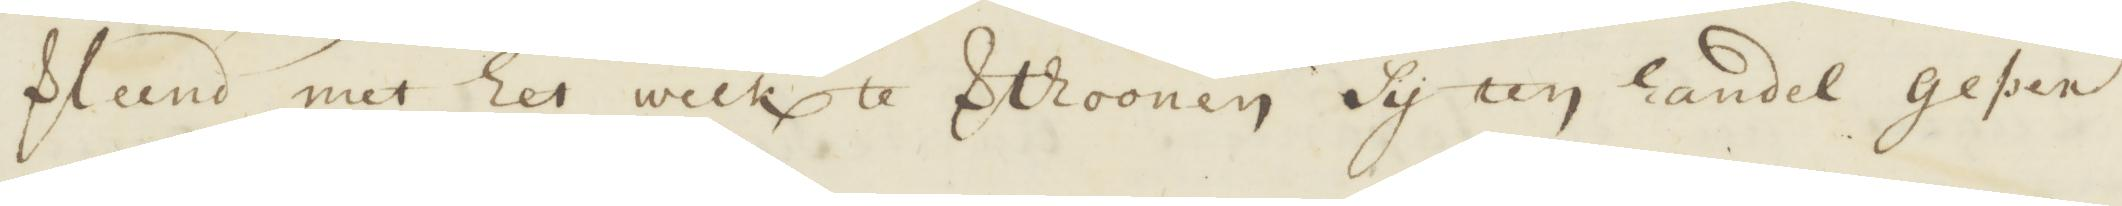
verleend met het welk te verthoonen sij ten handel geper
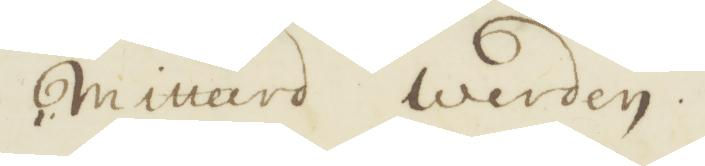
mineerd werden.
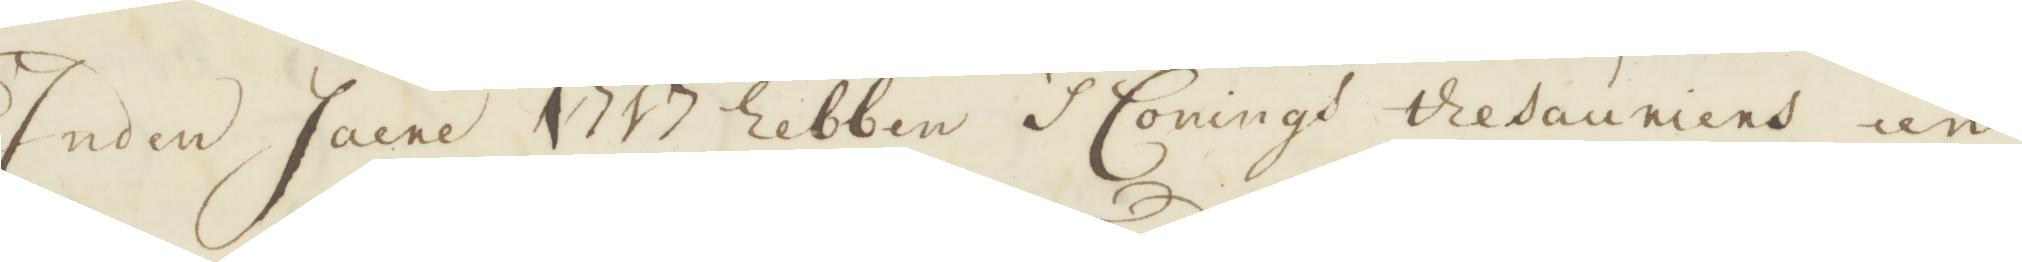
Jnden Jaere 1717 hebben 's Conings thesauriers een
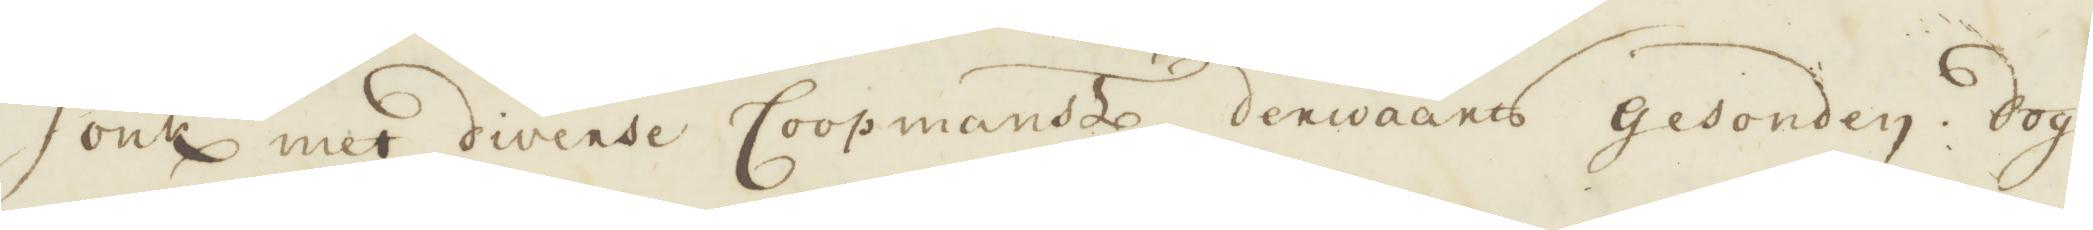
Jonk met diverse Coopmansz derwaarts gesonden. dog
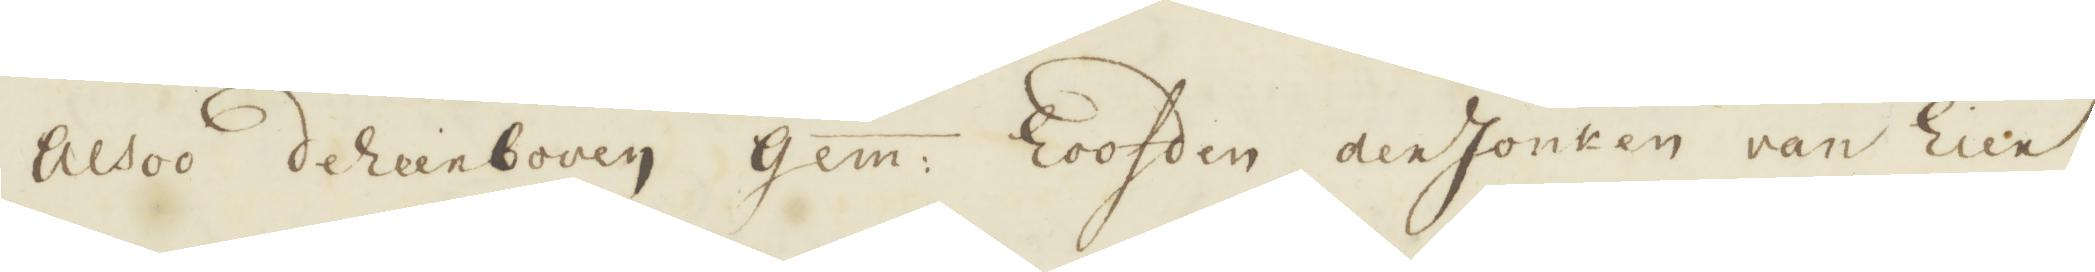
alsoo de hierboven gem: hoofden der Jonken van hier
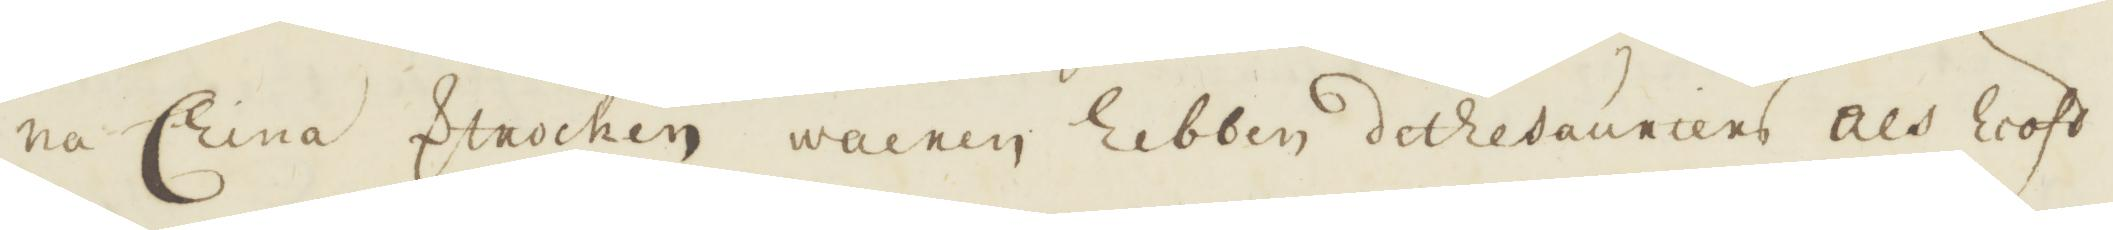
na China vertrocken waeren hebben de thesauriers als hoofd
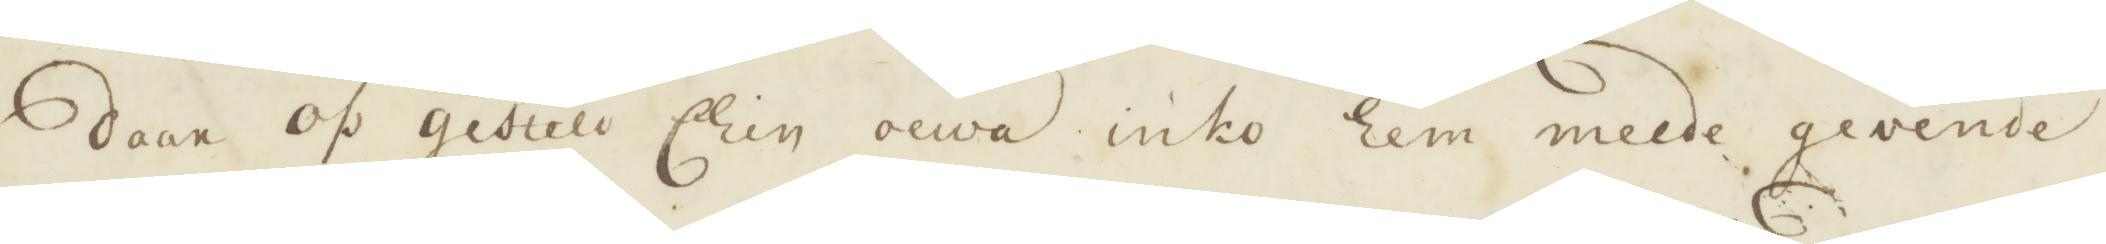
daar op gesteld Chin oewa inko hem meede gevende
